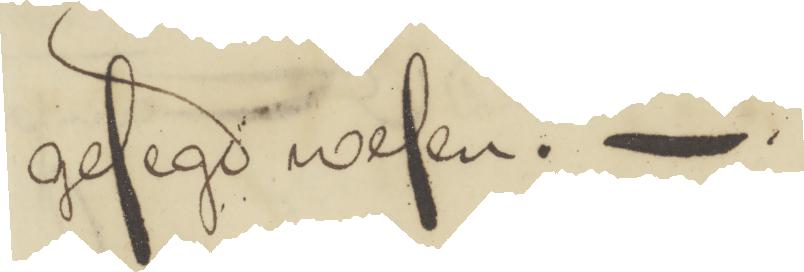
gesegd wesen. — .
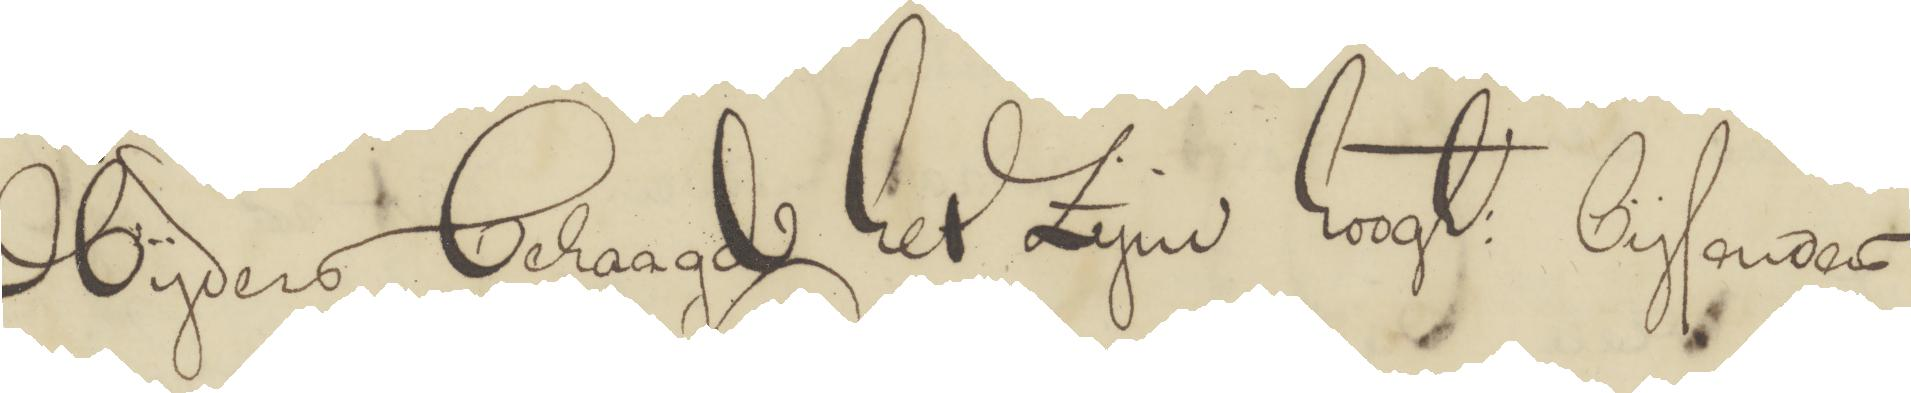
Wijders behaagde het zijne hoog:t bijsonder
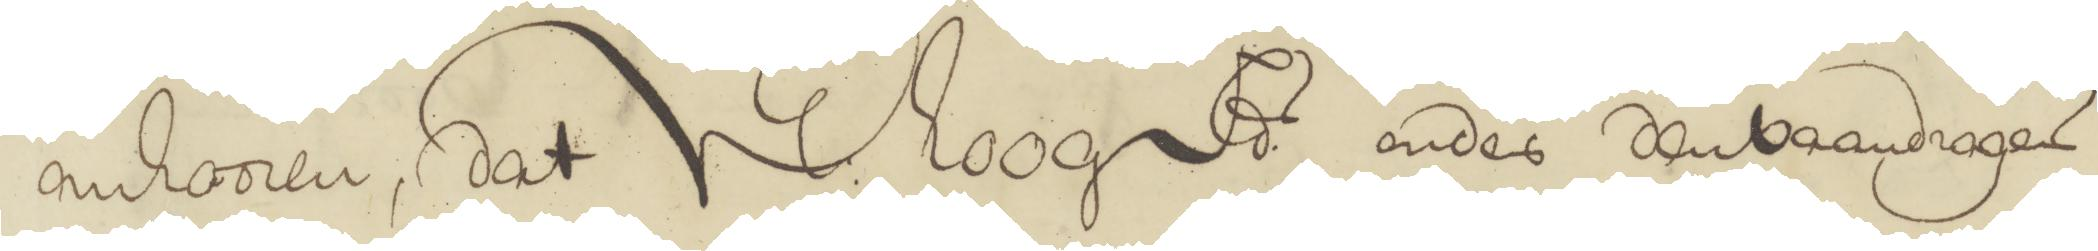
anhooren, dat UE: hoog Ed.s onder den vaandrager
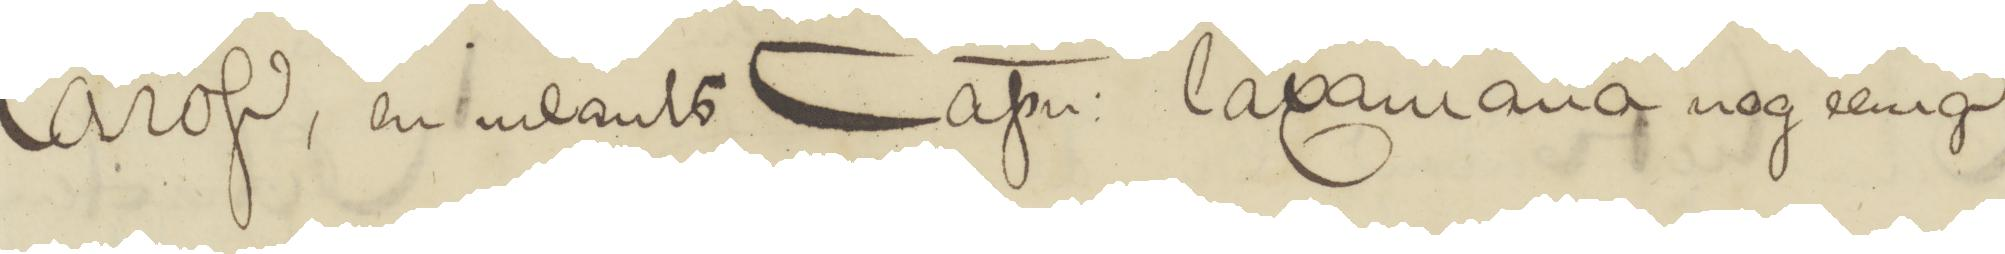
Larose, en inlants Capn: laxamana nog eenige
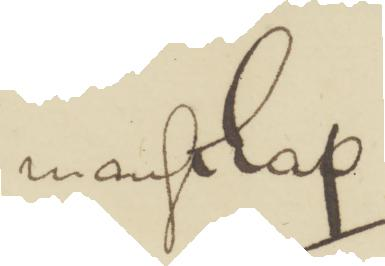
manschap
